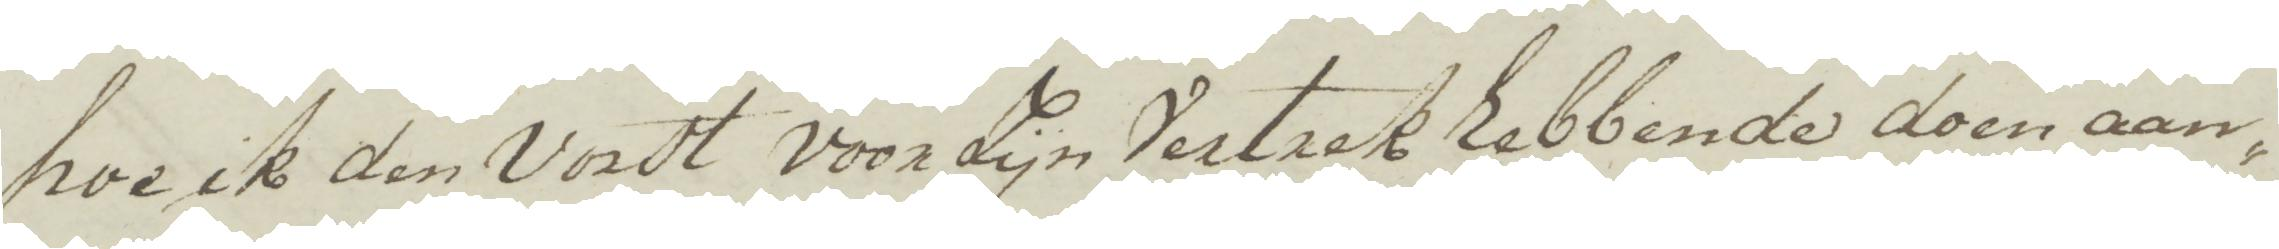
hoe ik den vorst voor zijn vertrek hebbende doen aan„
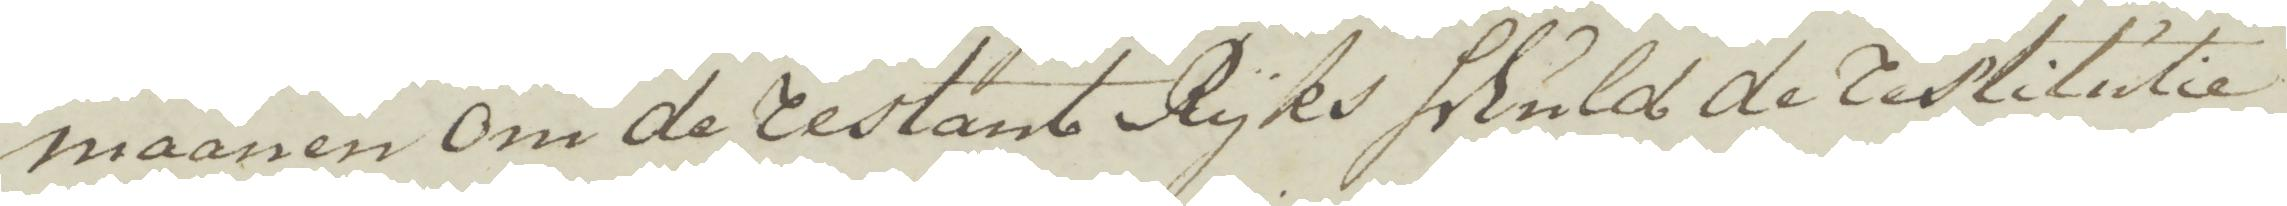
maanen om de restant Rijks schuld de restitutie
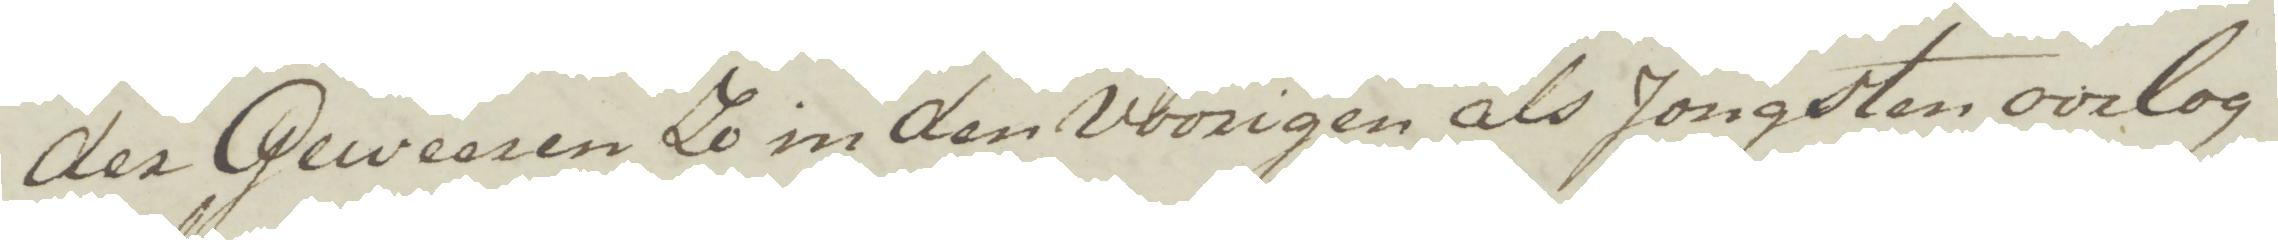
der Geweeren zo in den voorigen als Jongsten oorlog
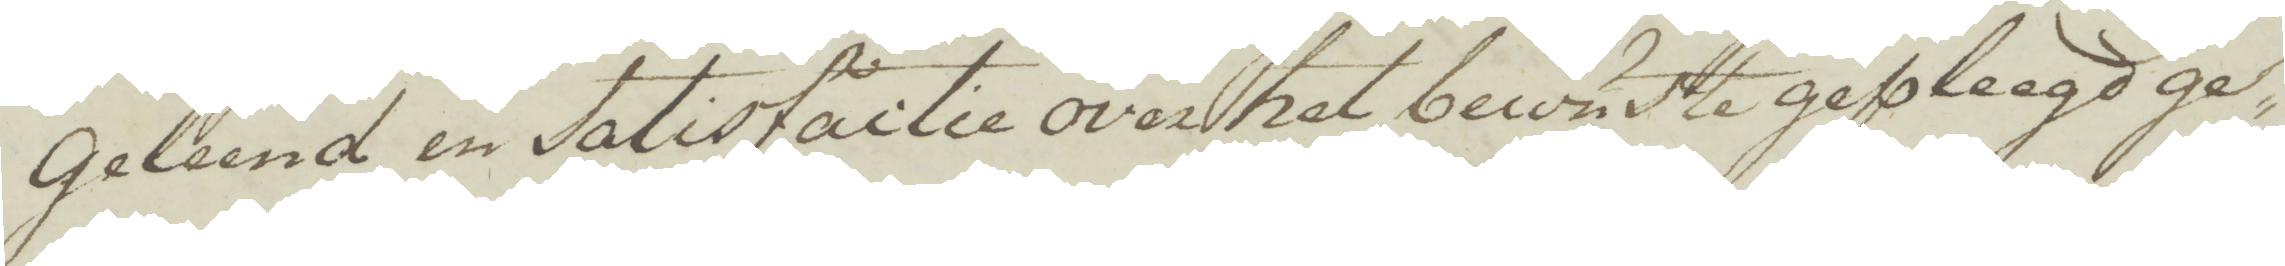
geleend en satisfactie over het bewuste gepleegd ge„
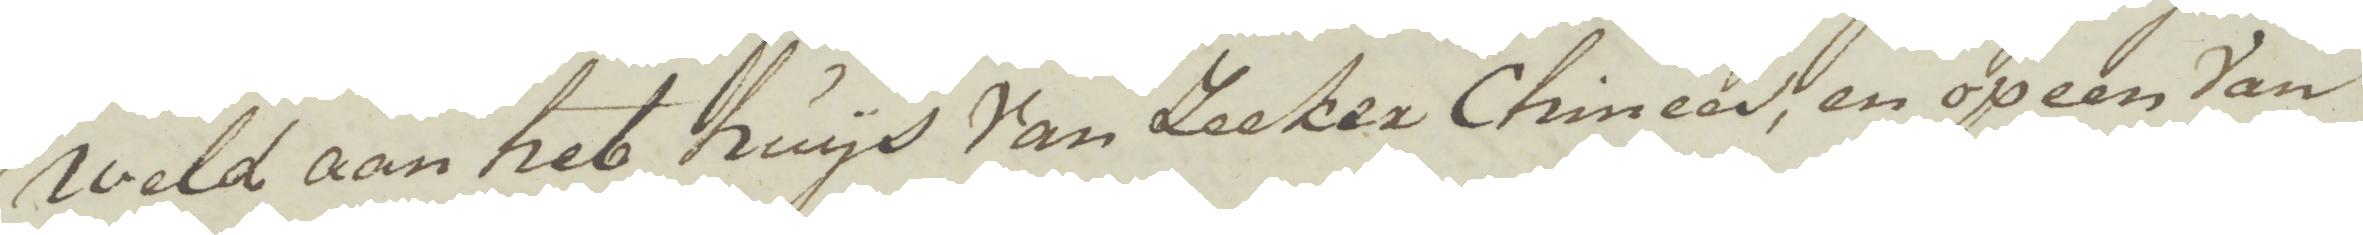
weld aan het huijs van zeeker Chinees, en op een van
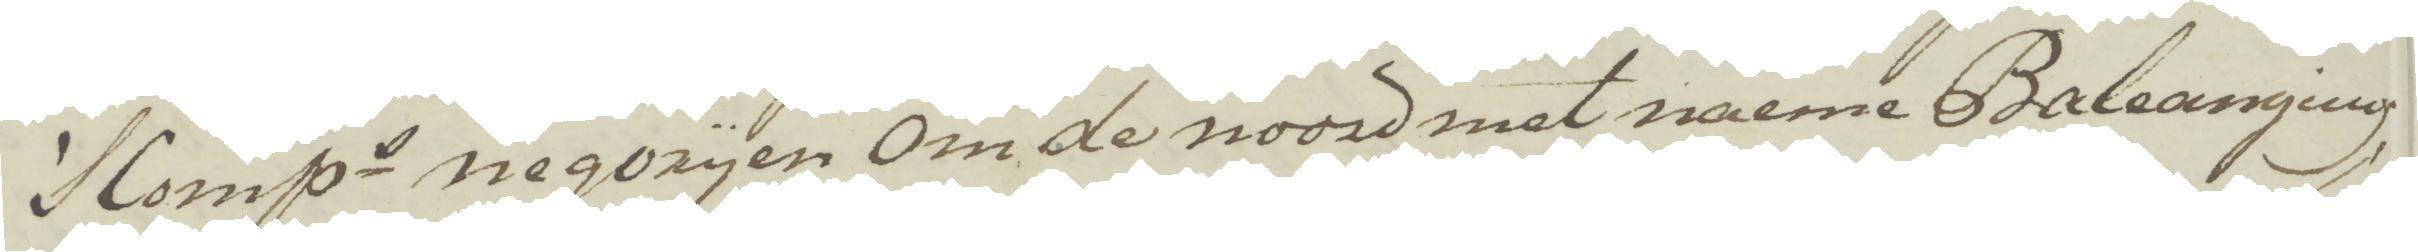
’s Comp=s negorijen om de noord met naeme Baleanging,
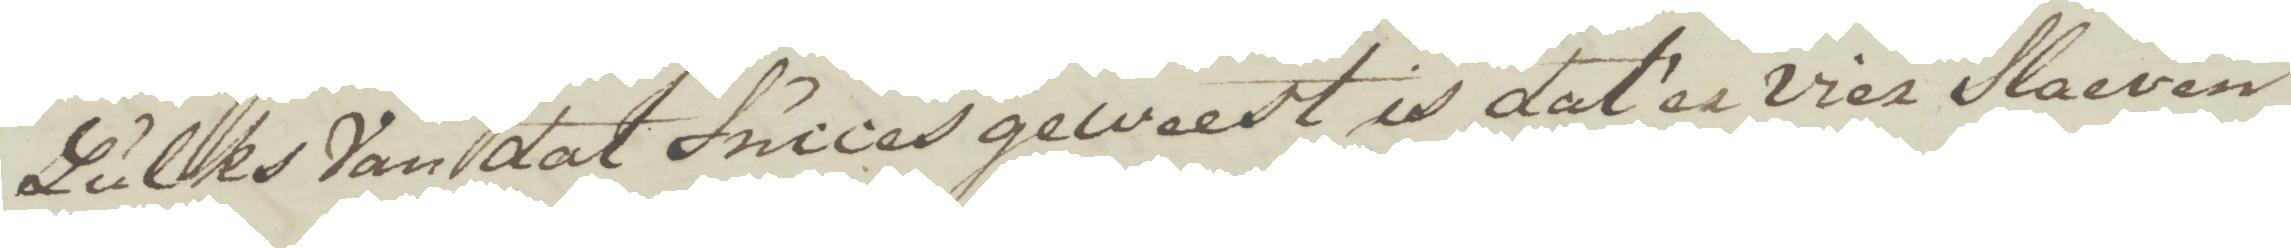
zulks van dat succes geweest is dat 'er vier slaeven
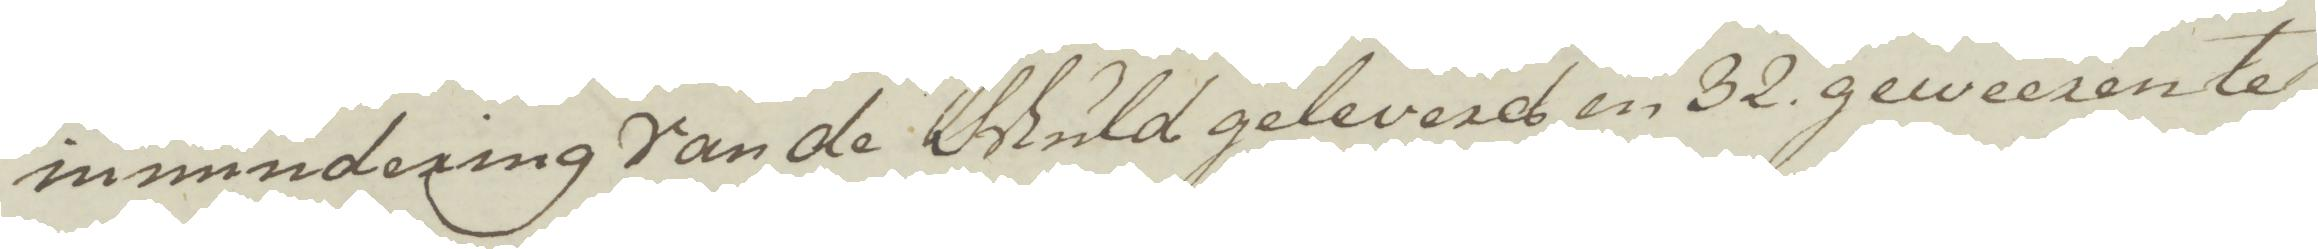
in mindering van de schuld geleverd en 32. geweeren te
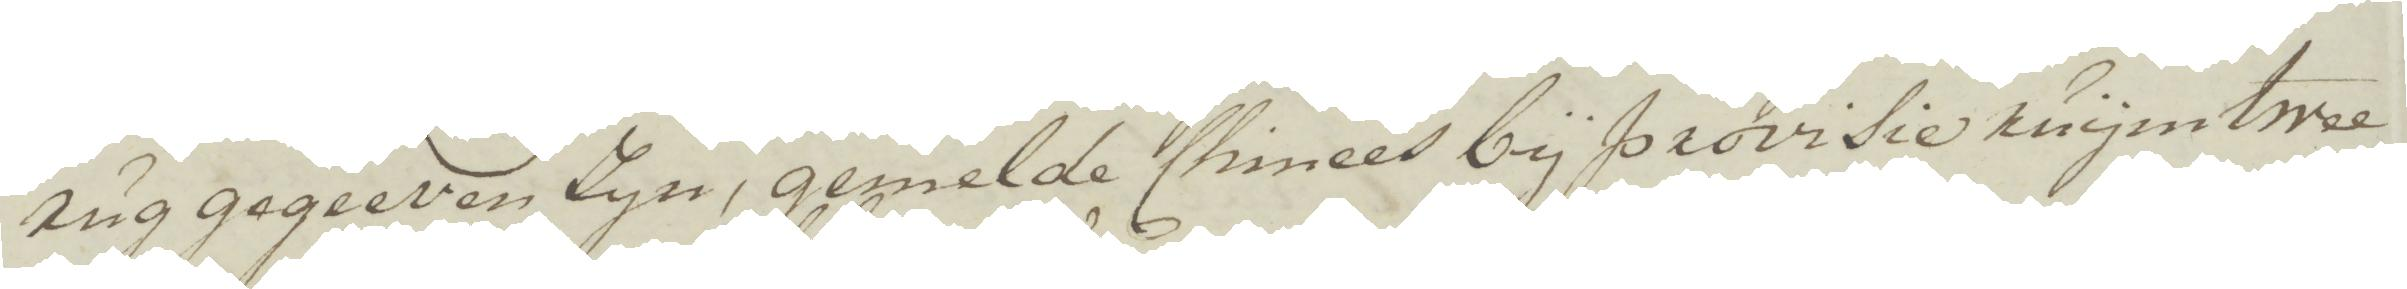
rug gegeeven zyn, gemelde Chinees bij provisie ruijm twee
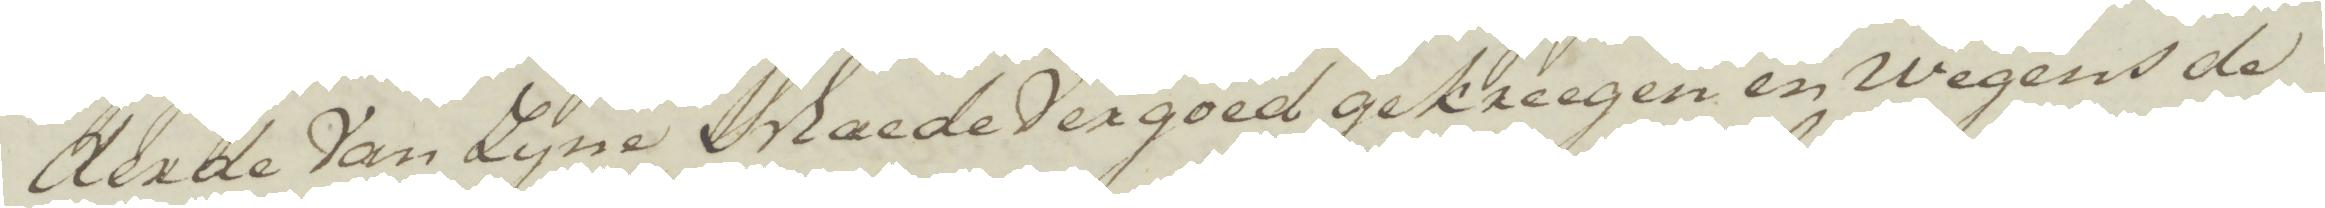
derde van zyne schaede vergoed gekreegen en wegens de
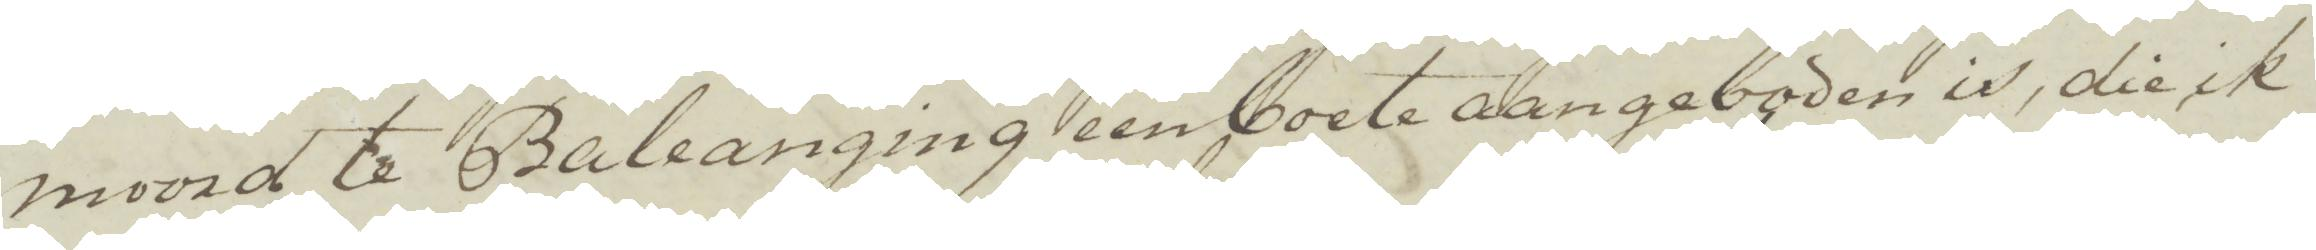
moord te Baleanging een boete aangeboden is, die ik
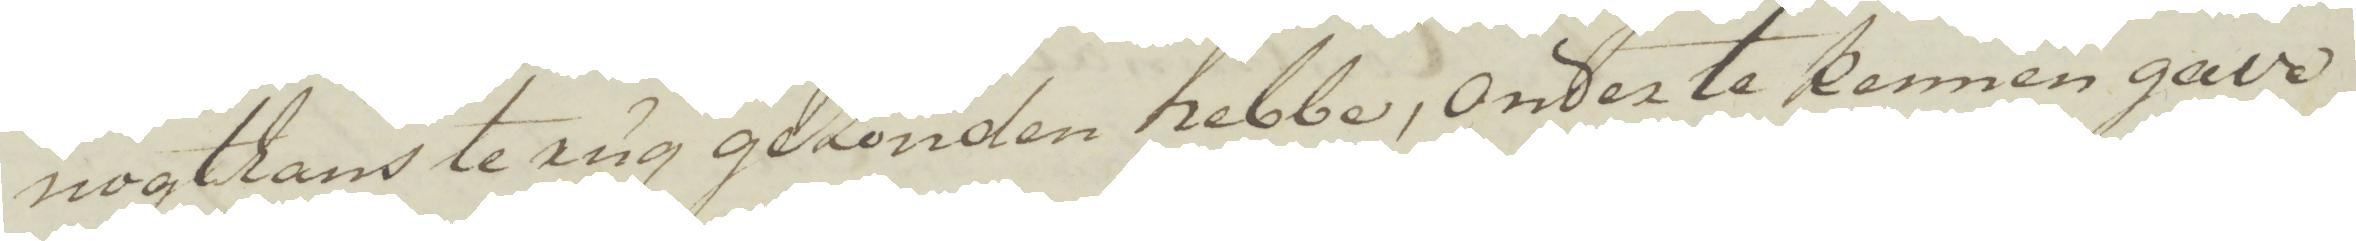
nogthans terug gezonden hebbe, onder te kennen gave
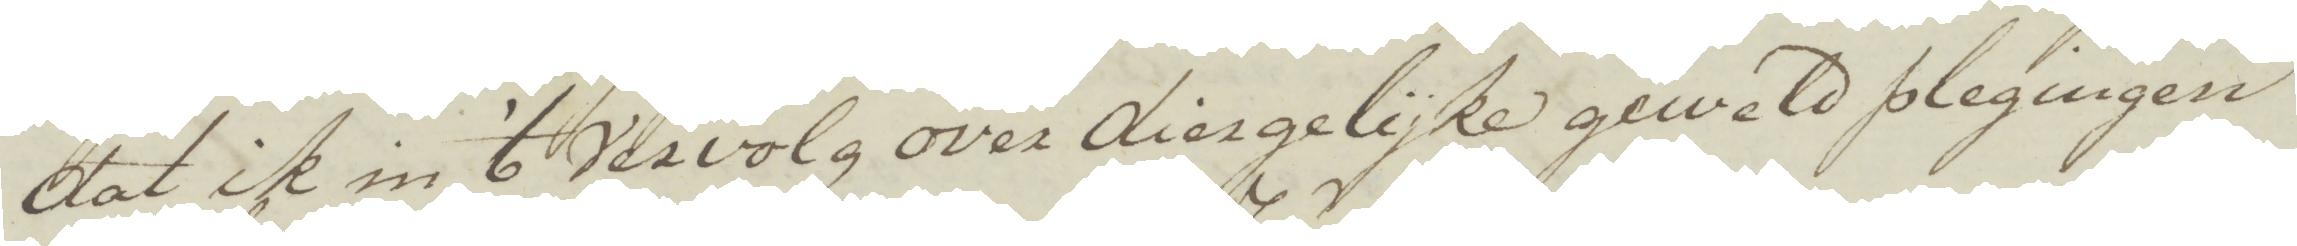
dat ik in ’t vervolg over diergelijke geweld plegingen
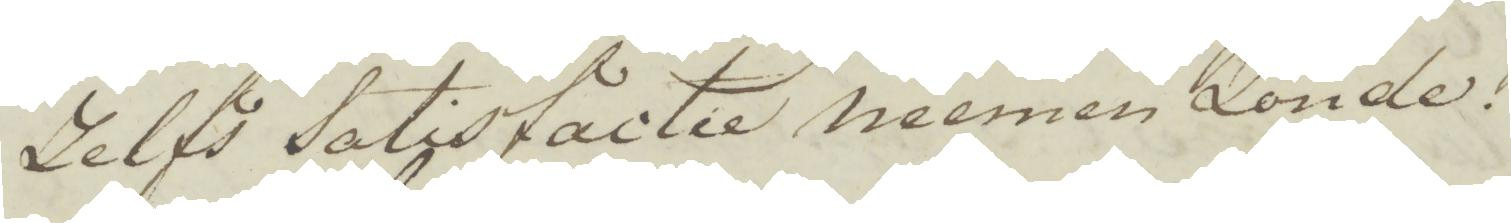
zelfs satisfactie neemen zoude.
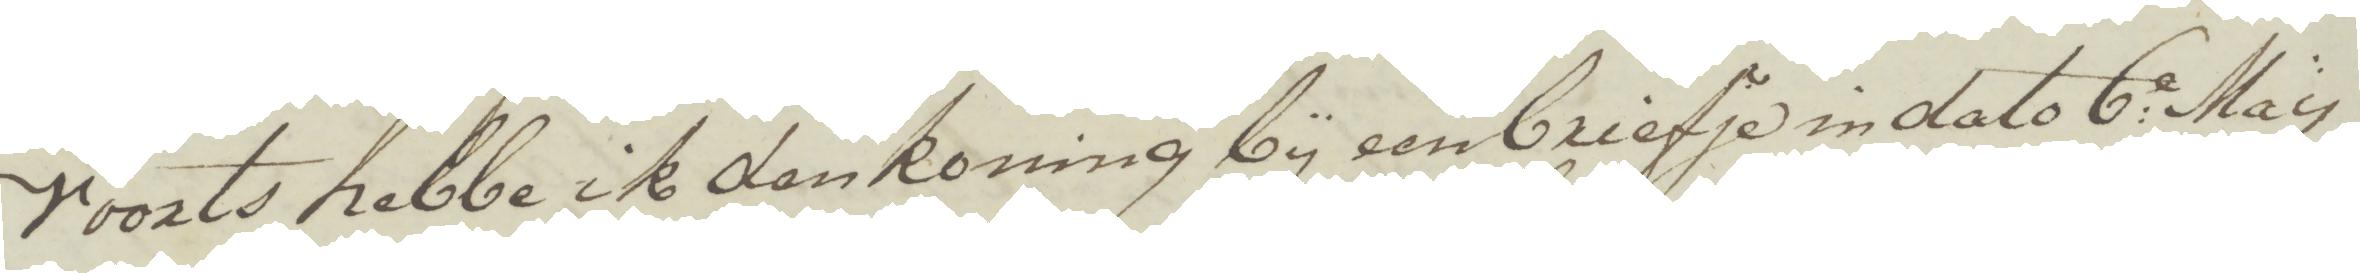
Voorts hebbe ik den koning bij een briefje in dato 6:e Maij
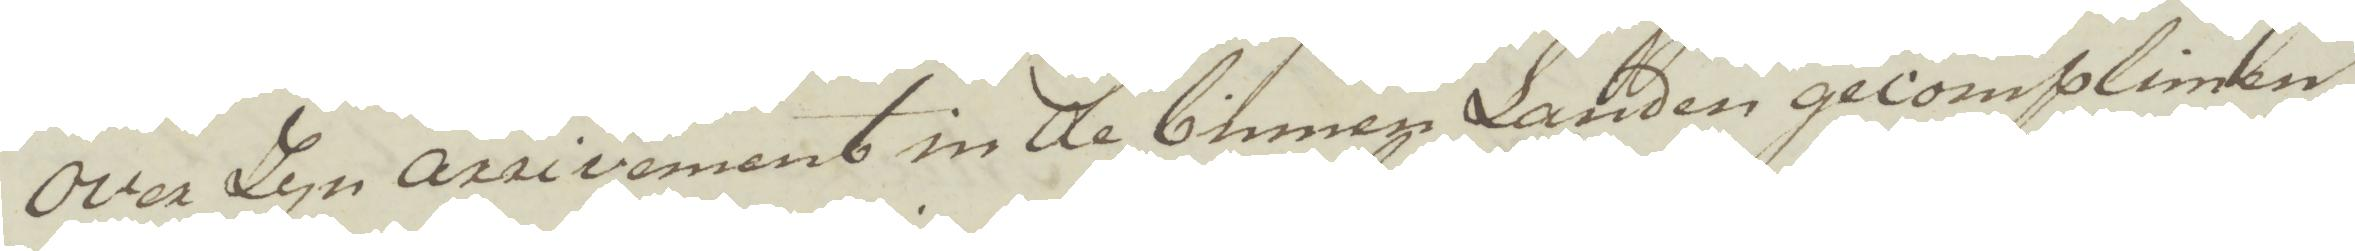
over zyn arrivement in de binnen Landen gecomplimen
